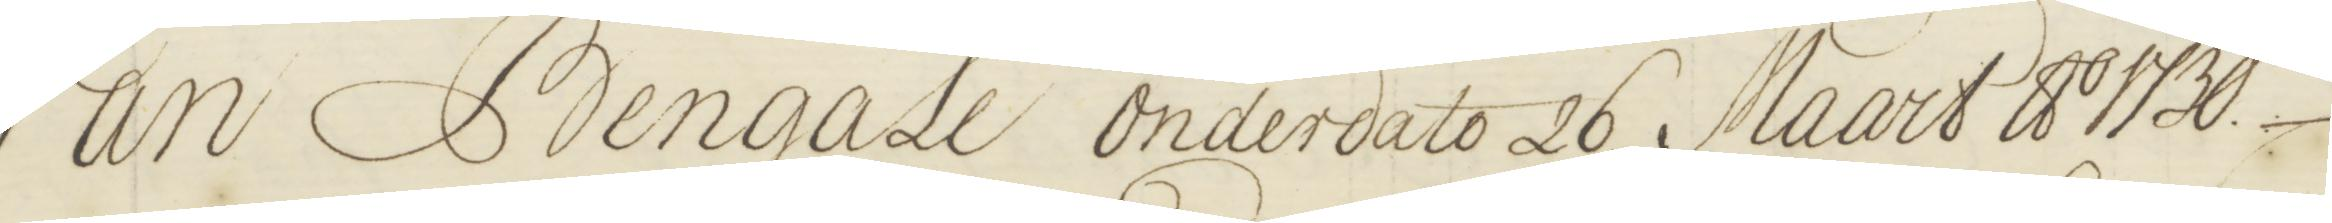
Van Bengale onder dato 26. Maart A:o 1730. —
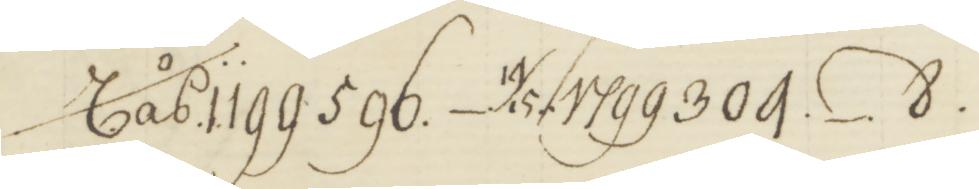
r:o/as. 199596. - 14/15 ƒ1799304.— 8.
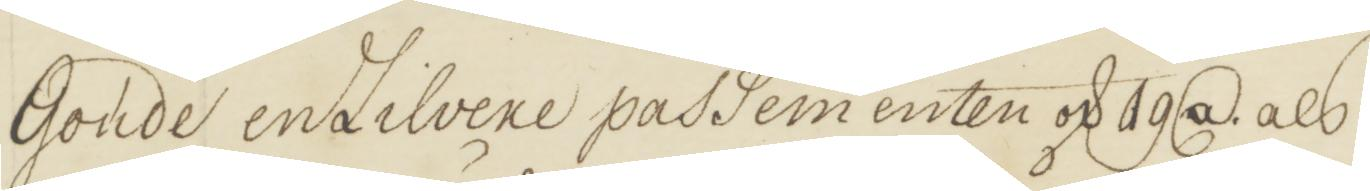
Goude en Zilvere passementen over 49 @. als
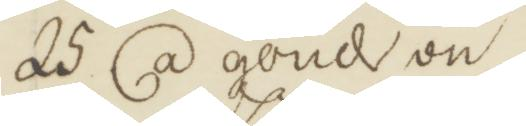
25 @ goud en
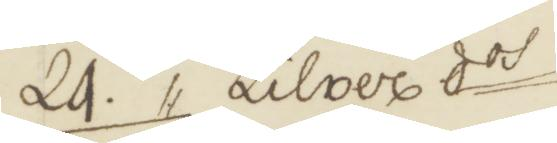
24. „ Zilver d=os
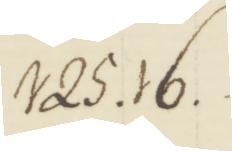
125.16.
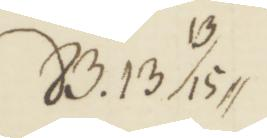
83:13 13/15 „
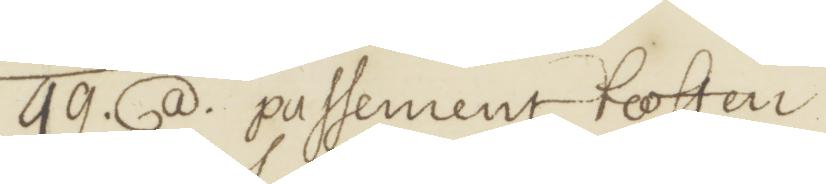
49. @ . passement kosten
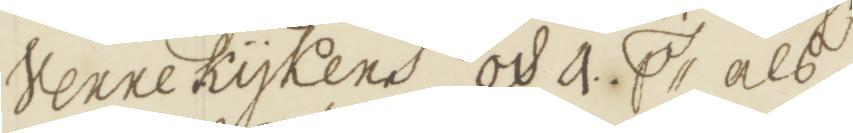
Verrekijkers over 4. p„s als
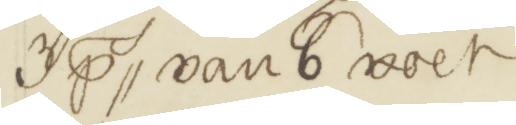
3 p„s van 6 voet
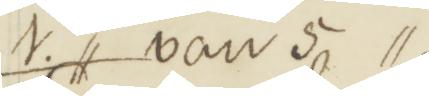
1„ van 5 „
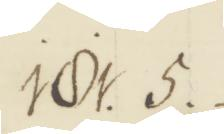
181: 5.
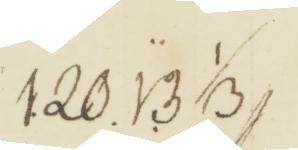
120.13 1/3 „
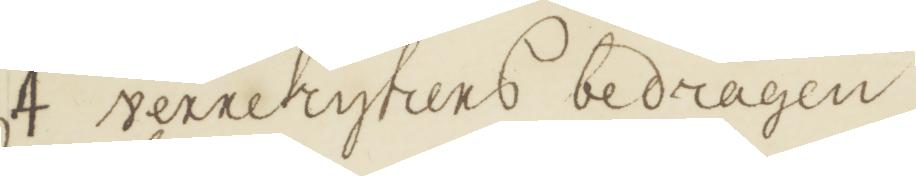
4 verrekijkers bedragen
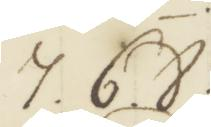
7. 6. 8:
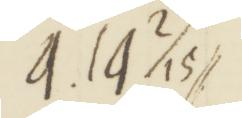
4.14 2/15
